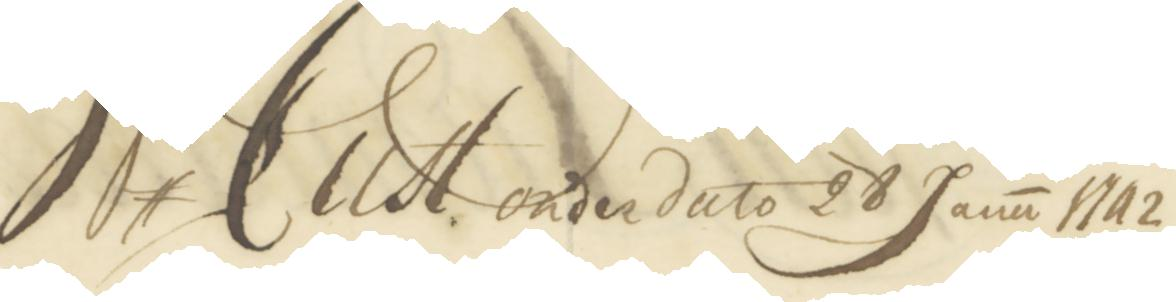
W#t Cust onder dato 28 Janu 1742
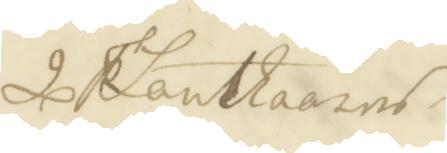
2ps lanthaarns
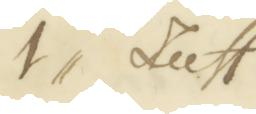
1 „ Zeeff
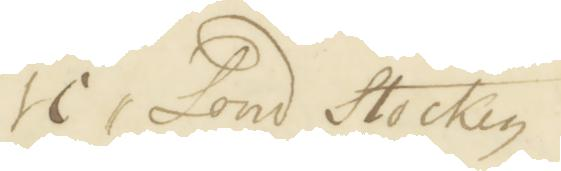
15 „ lond stocken
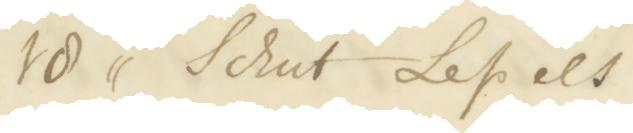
18 „ schut lepels
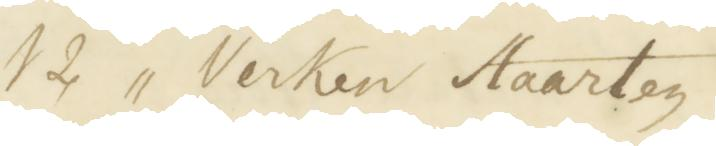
12 „ verken staarten
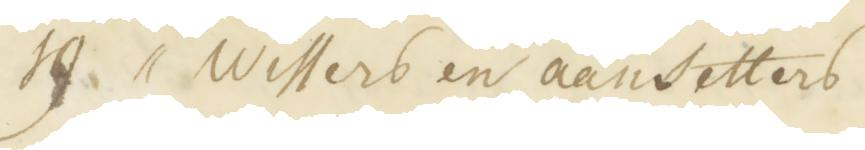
19 „ wissers en aansetters
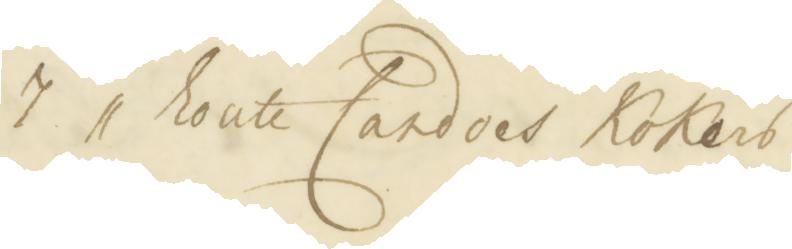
7 „ houte Cardoes kokers
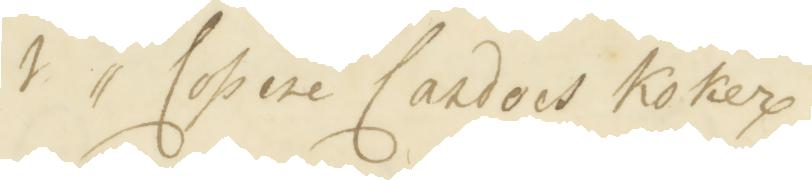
1 „ Copere Cardoes koker
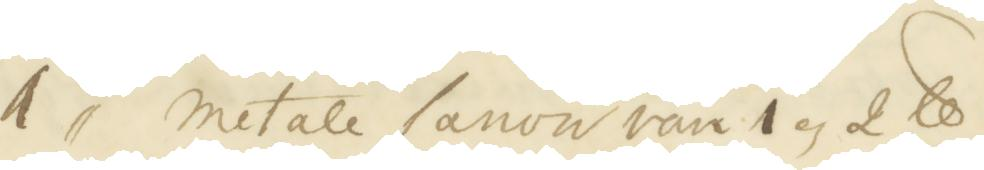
4 „ metale Canon van 1 en 2 lb
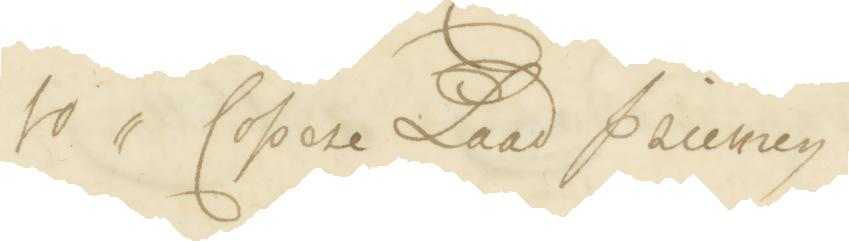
10 „ Copere laad priemen
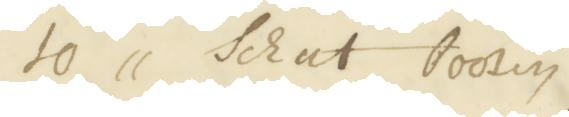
10 „ schut boom
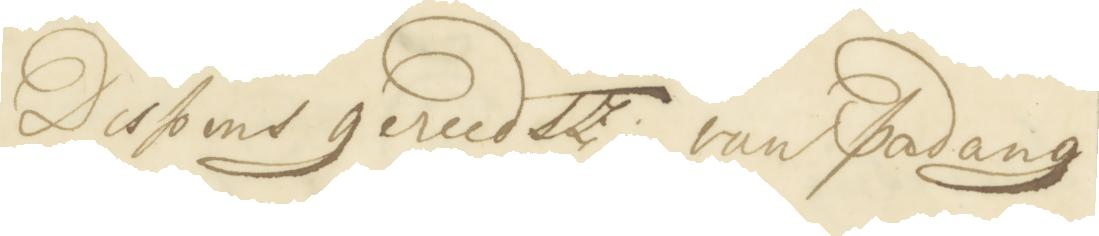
Dispens gereedsz: van Padang
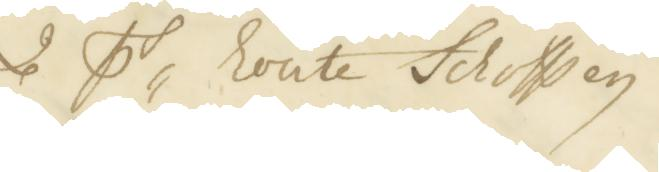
2 p„s houte schoppen
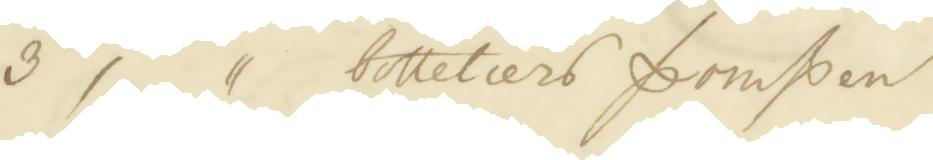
3 / „ botteliers pompen
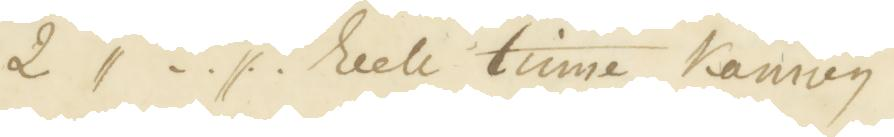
2 „ _.„.. heele tinne kannen
